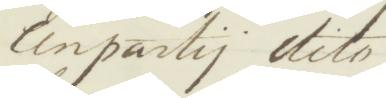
Eenpartij dito
